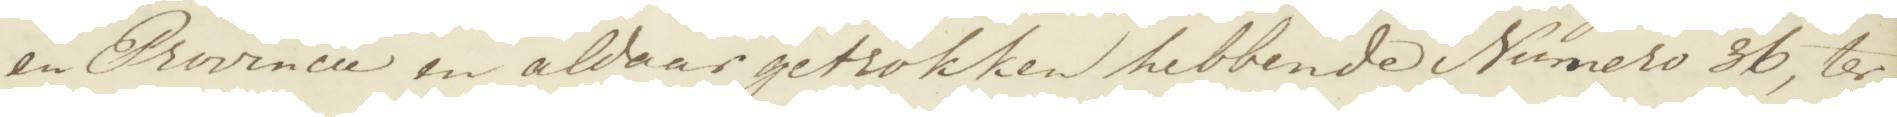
en Provincie en aldaar getrokken hebbende Numero 36, ter
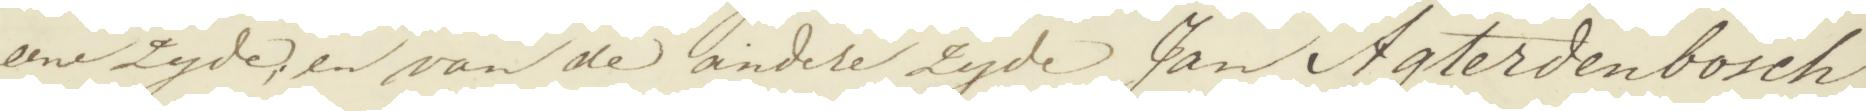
eene zyde, en van de andere zyde Jan Agterdenbosch,
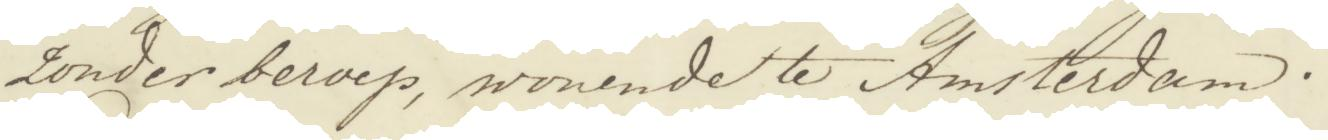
zonder beroep, wonende te Amsterdam.
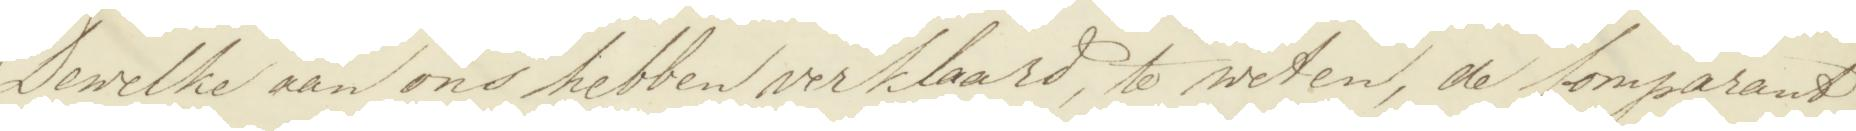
Dewelke aan ons hebben verklaard, te weten, de Comparant
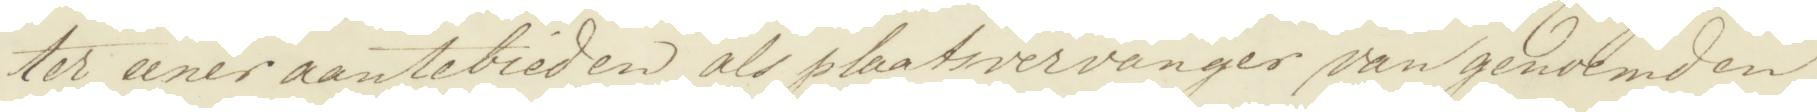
ter eener aantebieden als plaatsvervanger van genoemden
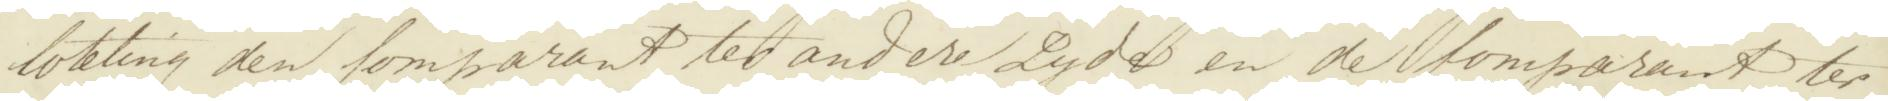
loteling den Comparant ter andere zyde en de Comparant ter
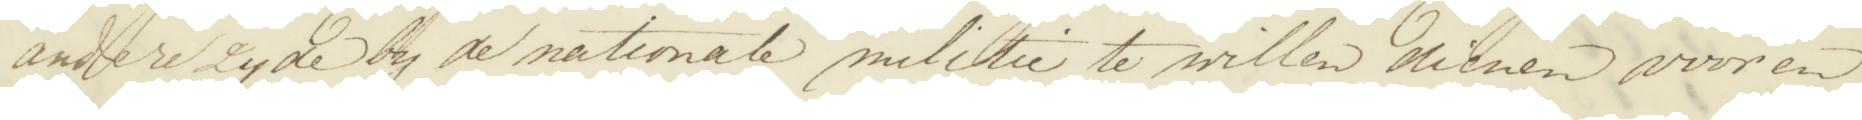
andere zyde by de nationale militie te willen dienen voor en
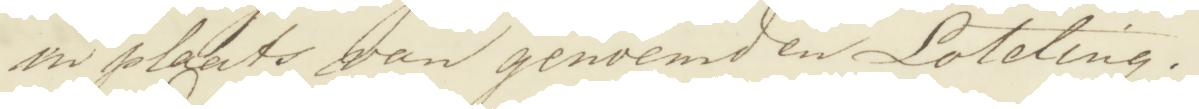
in plaats van genoemden Loteling.
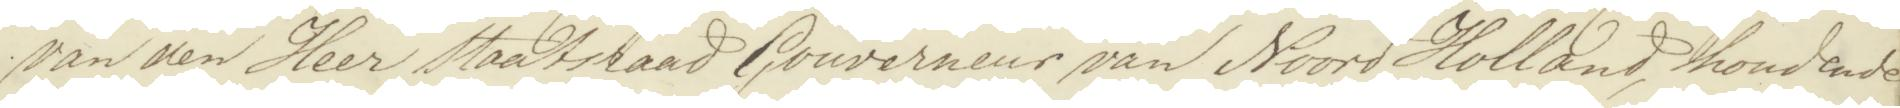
van den Heer staatsraad Gouverneur van Noord Holland, houdende
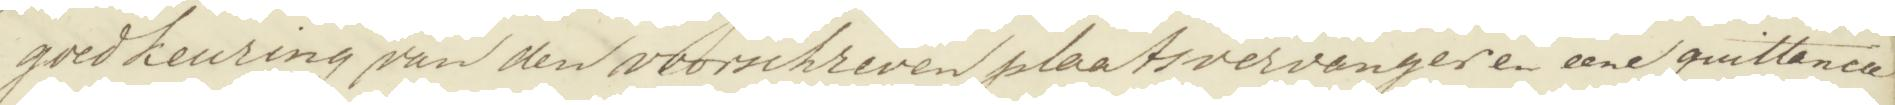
goedkeuring van den voorschreven plaatsvervanger en eene quittancie
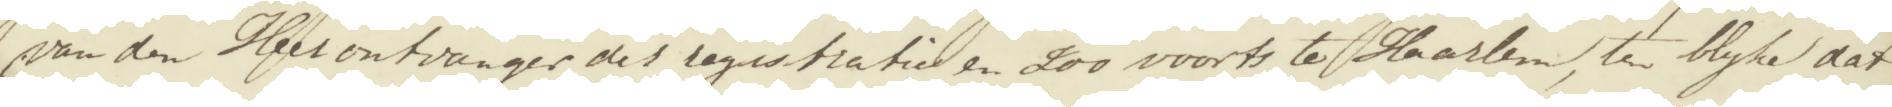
van den Heer ontvanger des registratie en zoo voorts te Haarlem, ten blyke dat
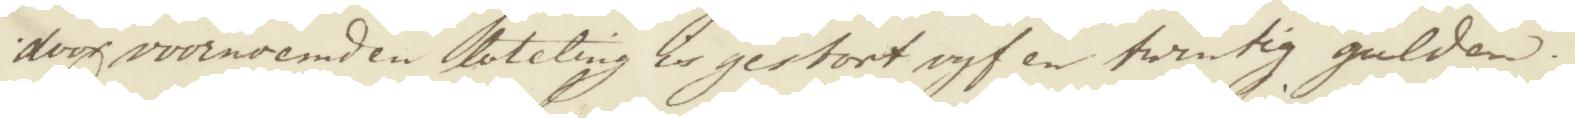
door voornoemden loteling is gestort vyf en twintig gulden.
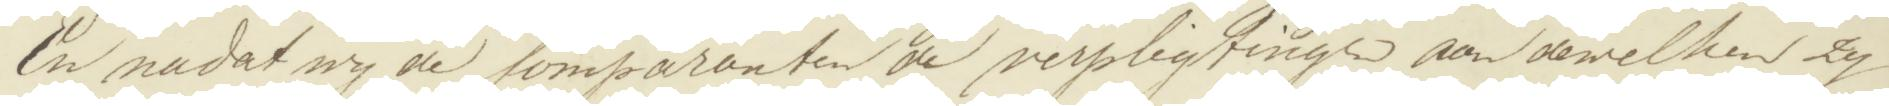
En nadat wy de comparanten de verpligtingen aan dewelken zy
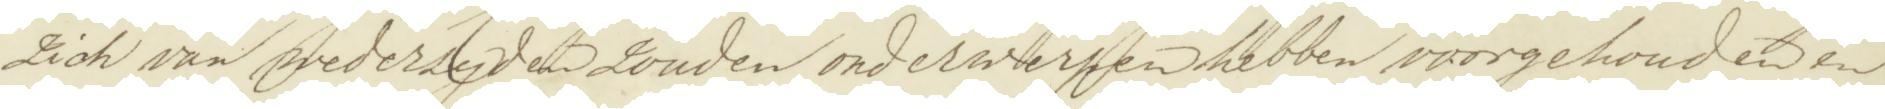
zich van wederzyden zouden onderwerpen hebben voorgehouden en
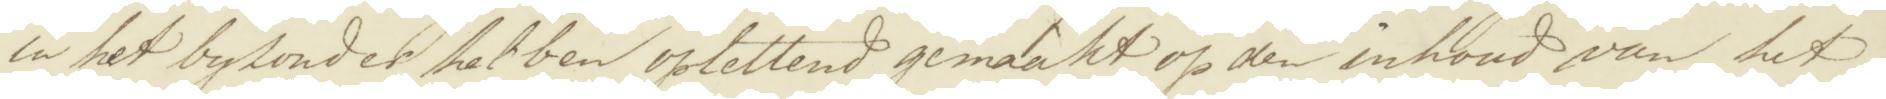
in het byzonder hebben oplettend gemaakt op den inhoud van het
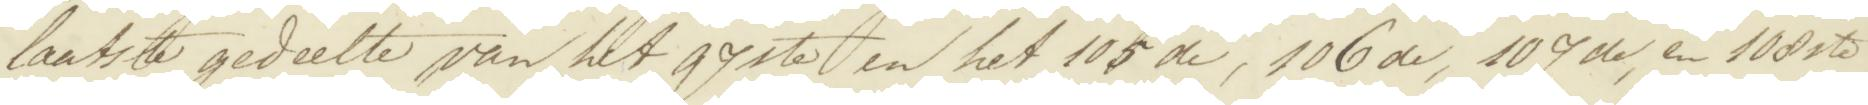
laatste gedeelte van het 97ste en het 105de, 106de, 107de, en 108ste
